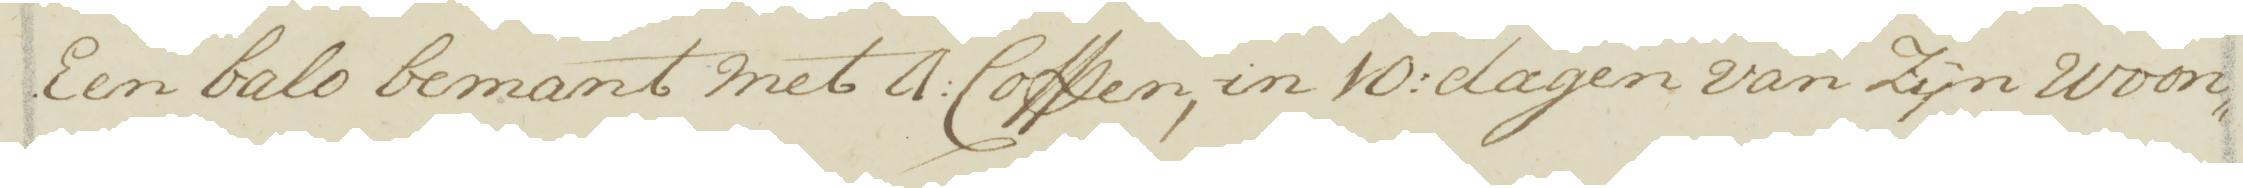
Een balo bemant met 4: Coppen, in 10: dagen van zijn woon„
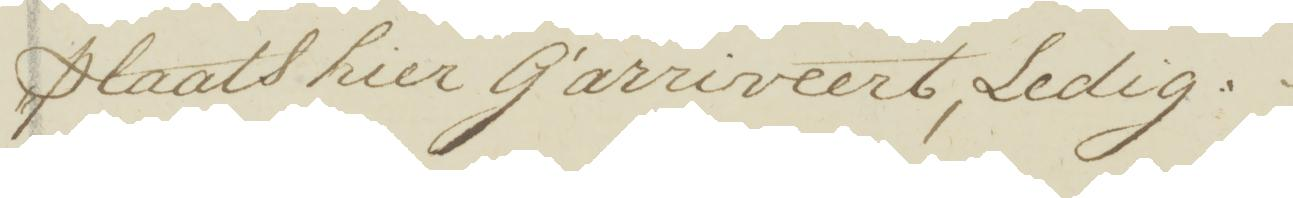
„plaats hier g'arriveert, ledig.
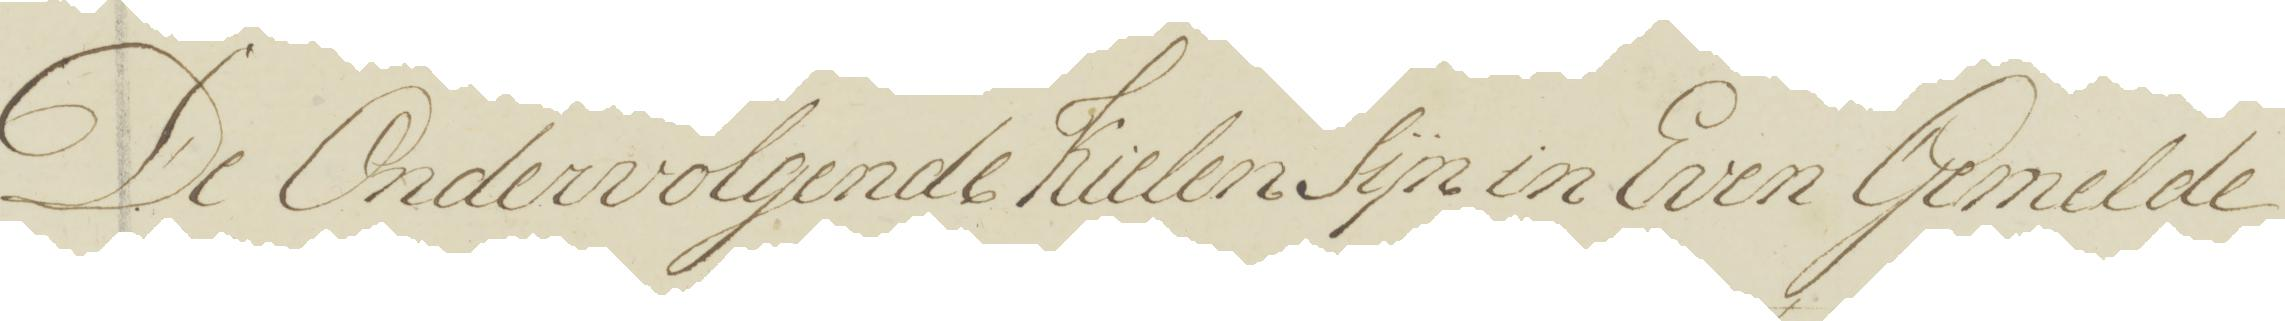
De Ondervolgende kielen sijn in Even Gemelde
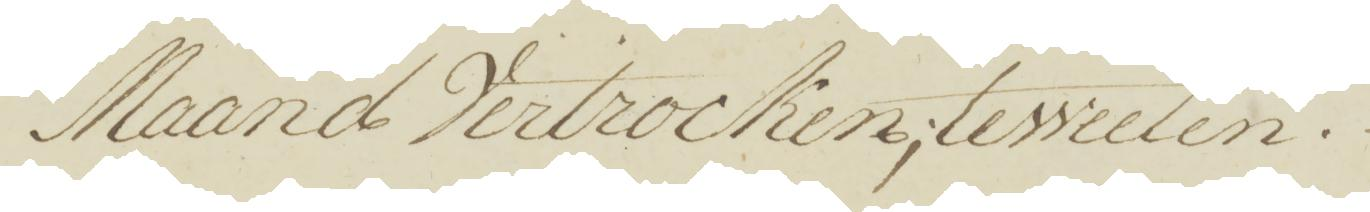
Maand Vertrocken; teweeten.
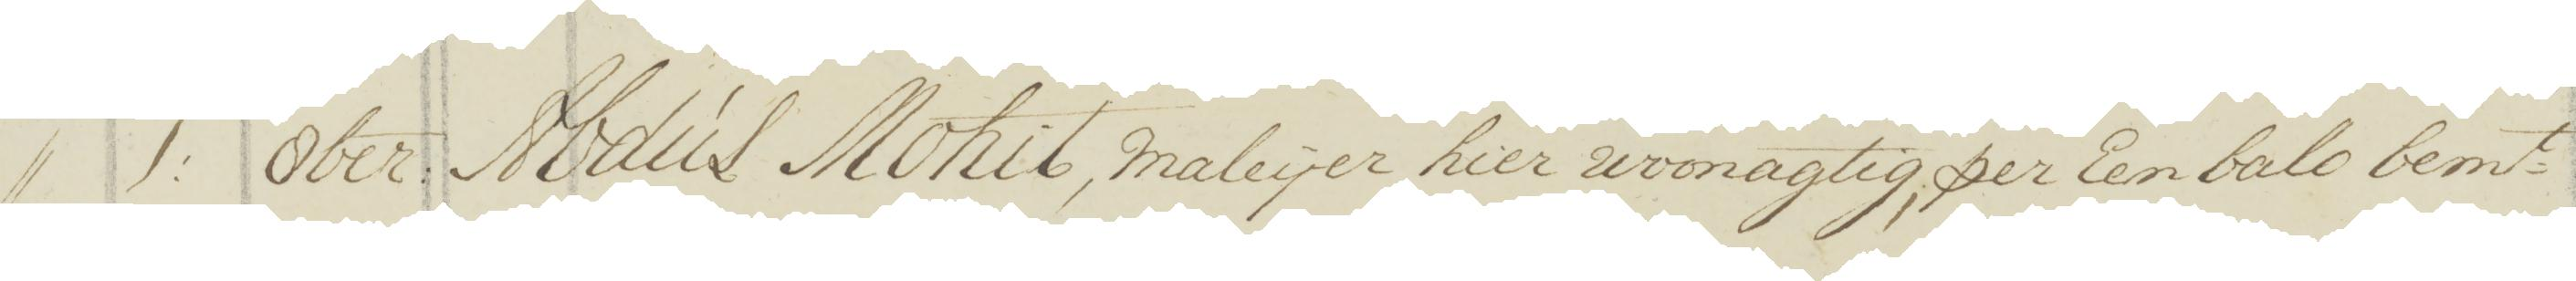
„ 1: 8ber: Abdus Mohit, maleijer, hier woonagtig; per Een balo bem=t
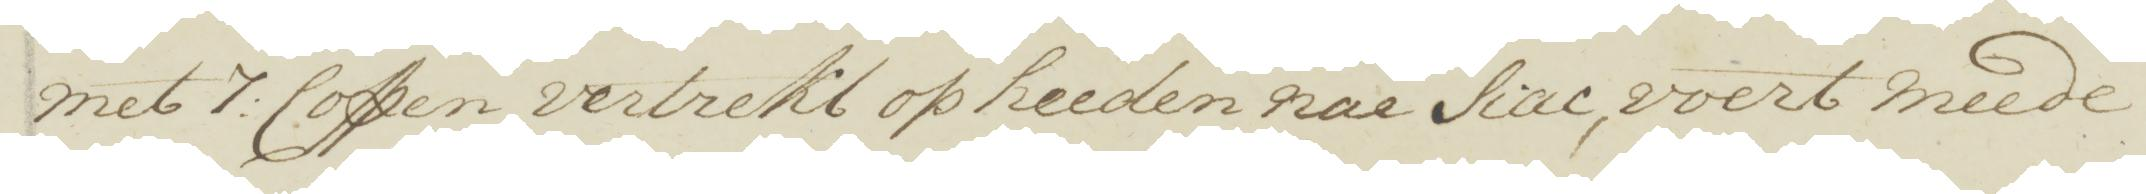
met 7: Coppen, vertrekt op heeden nae siac, voert meede
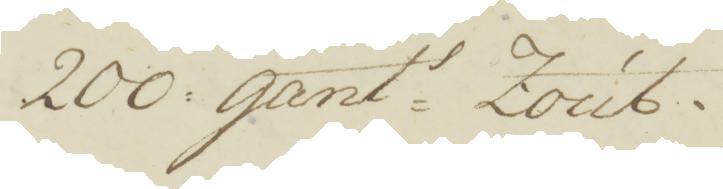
200: gant=s zout.
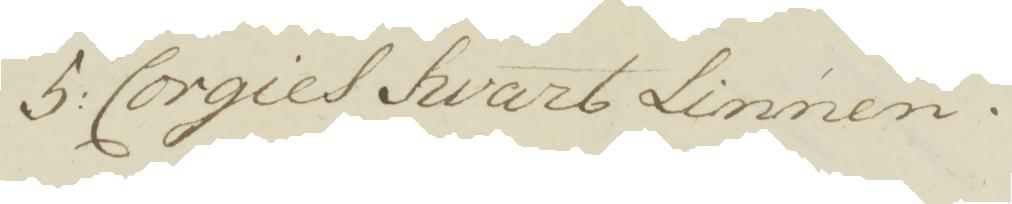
5: Corgies swart Linnen.
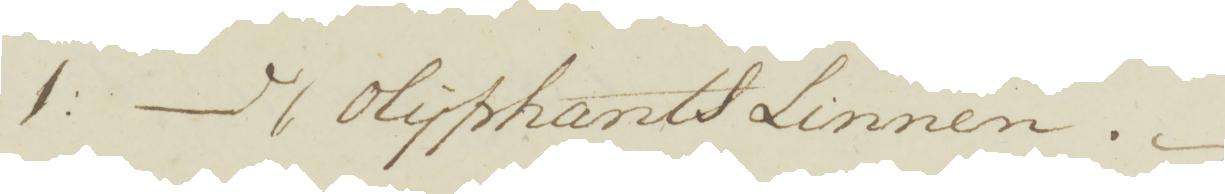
1: _„o olijphants Linnen. —
